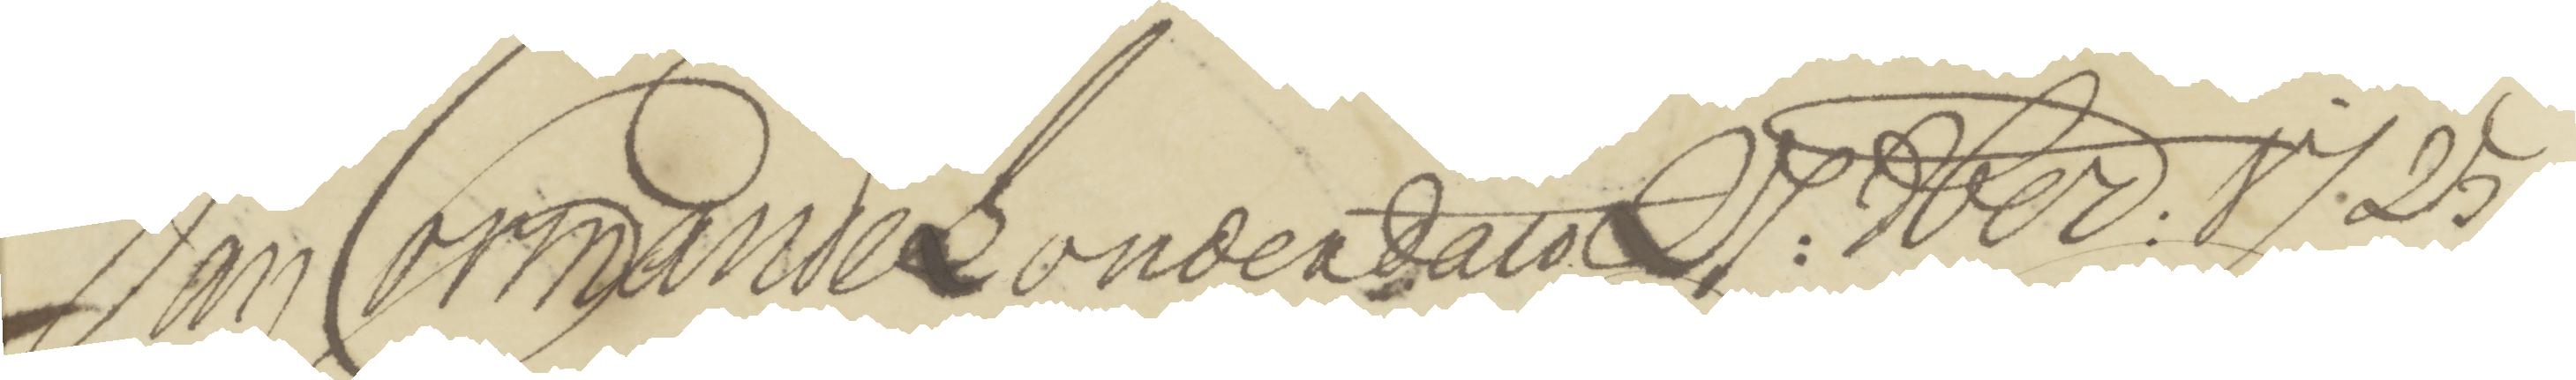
Van Cormandel onder dato 27: 8ber: 1725 —
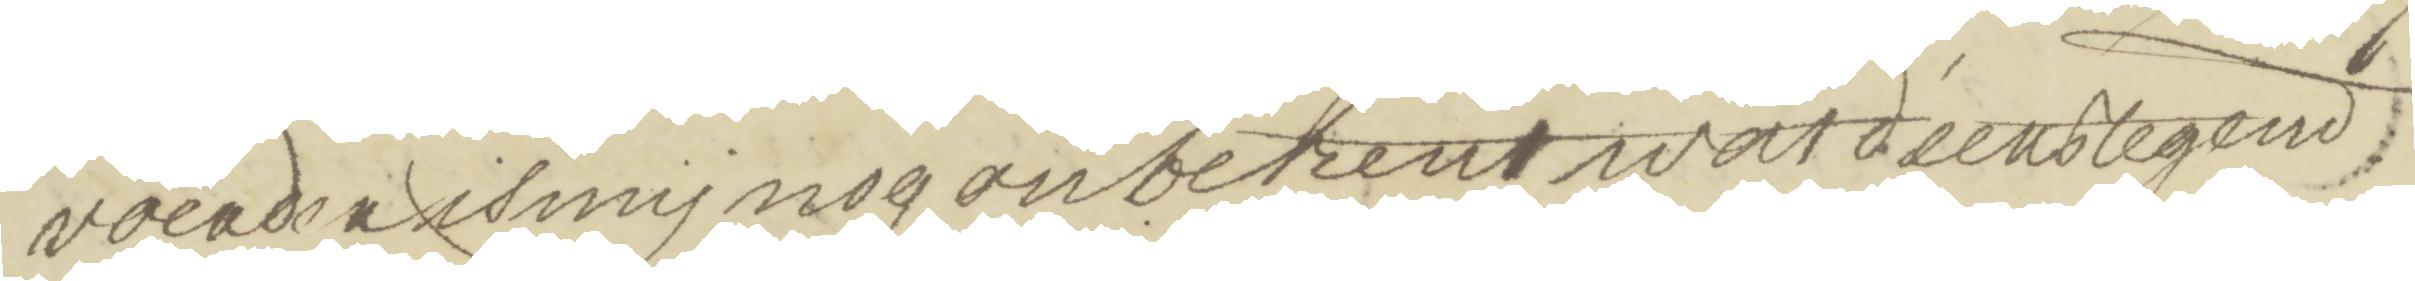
voerder is mij nog onbekent wat d'eerstegend
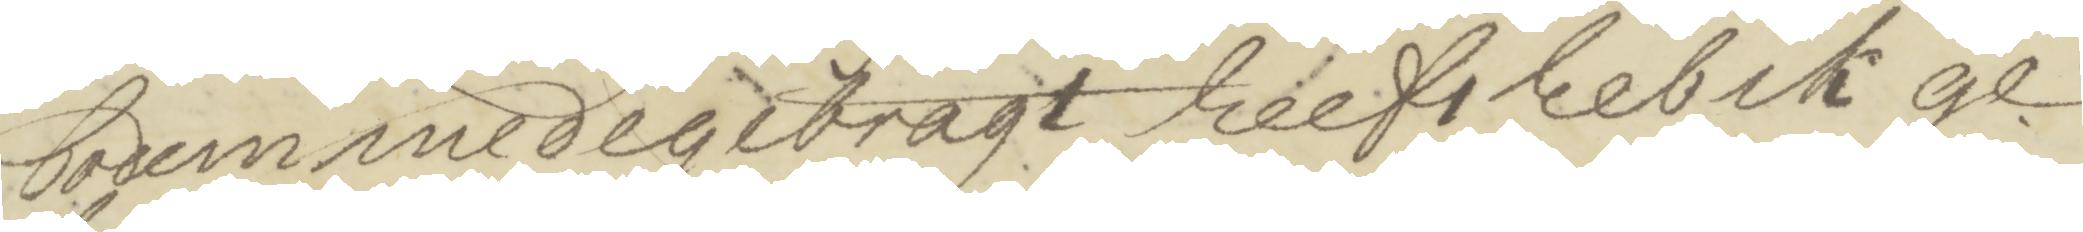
bodem medegebragt heeft heb ik ge„
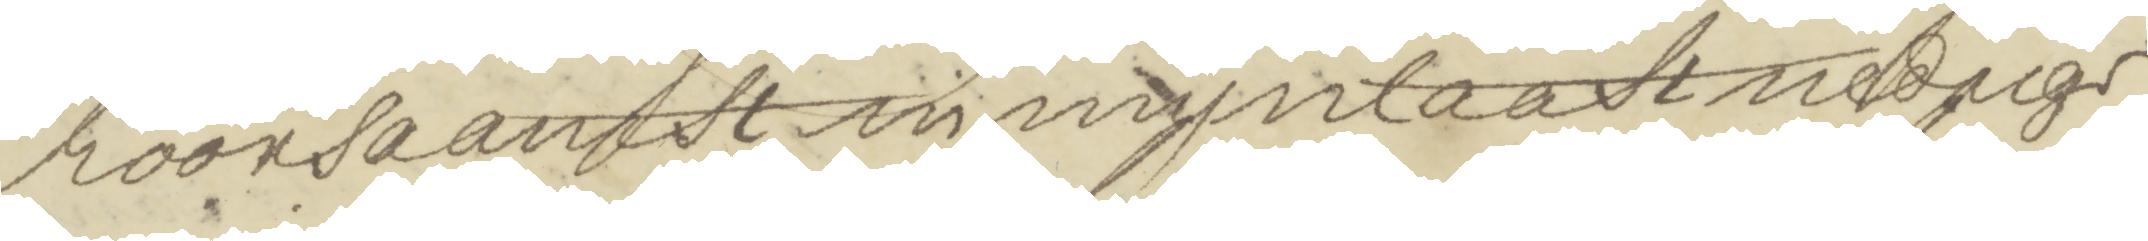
hoorsaamst in mijn laast nedrige
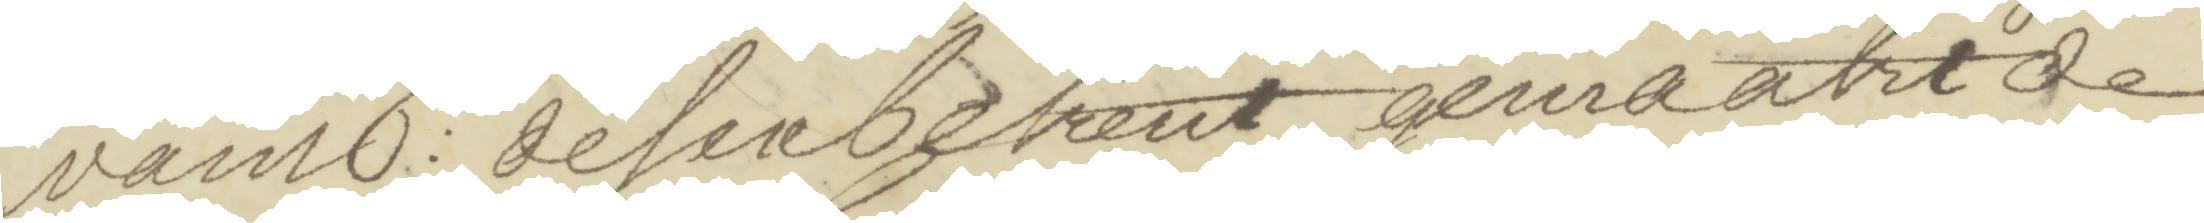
van 16: deser bekent gemaakt de
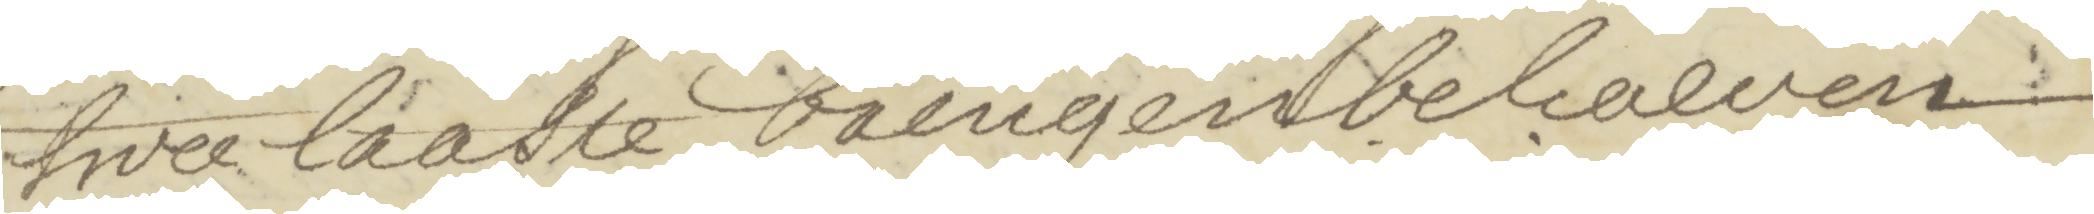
twee laaste brengen behalven
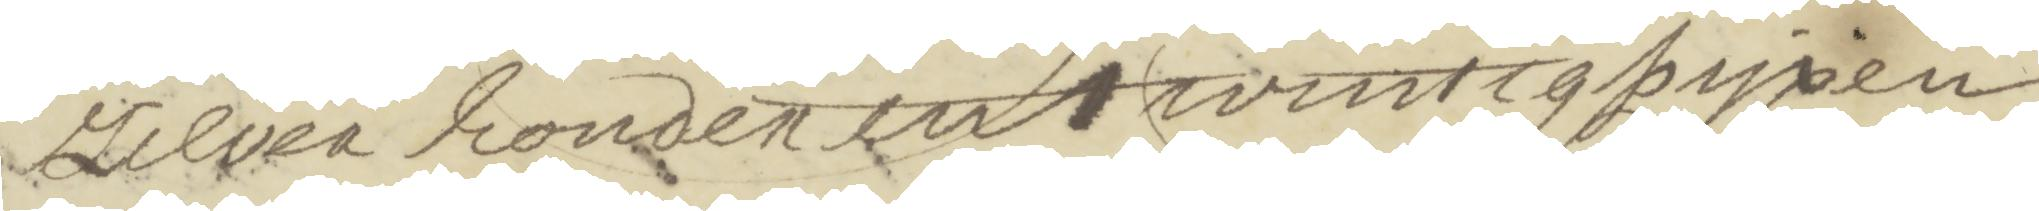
zelver honder en twintig pijpen
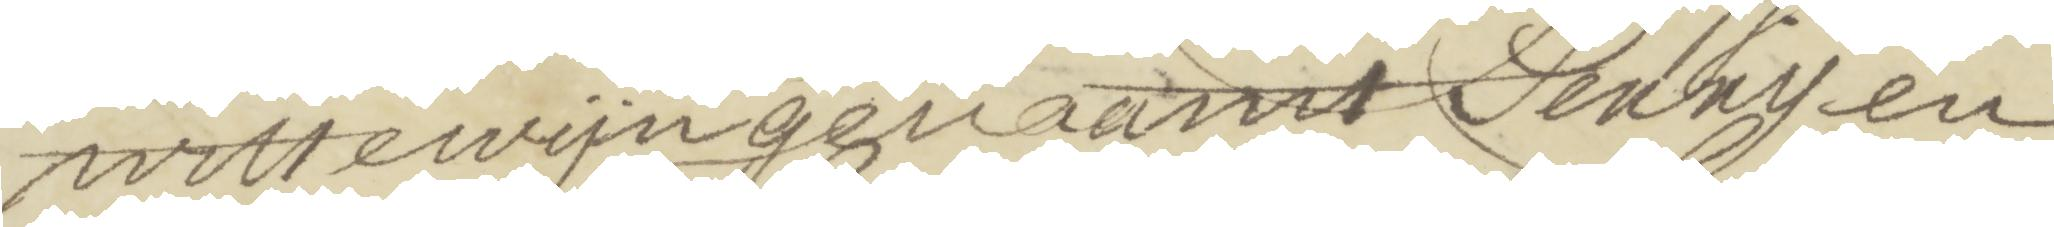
wittewijn genaamt Serrij en
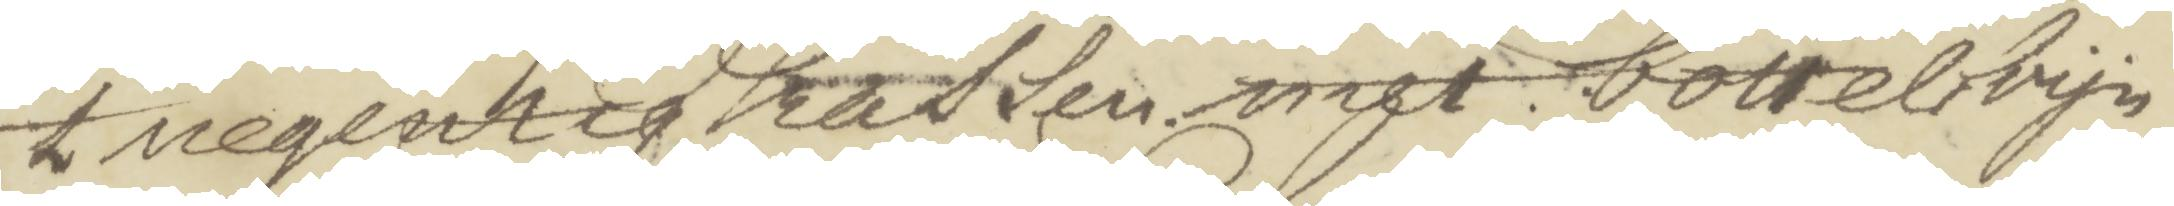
tnegentig kassen met bottelwijn
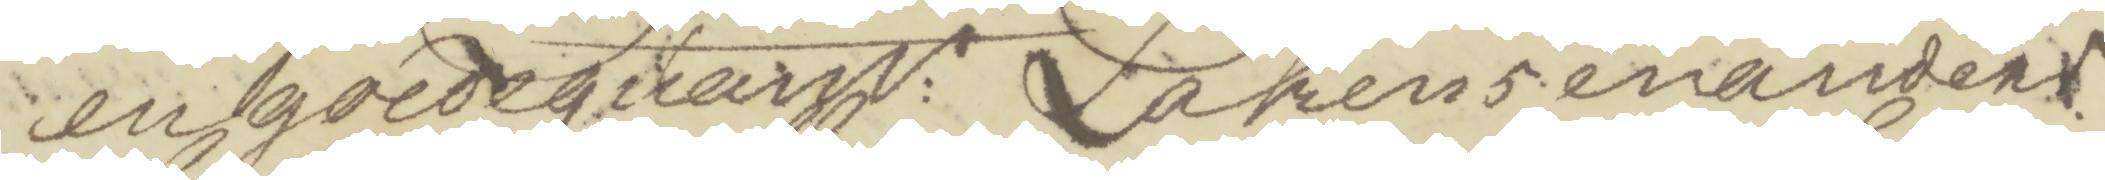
en goede quant:t Lakens en anders
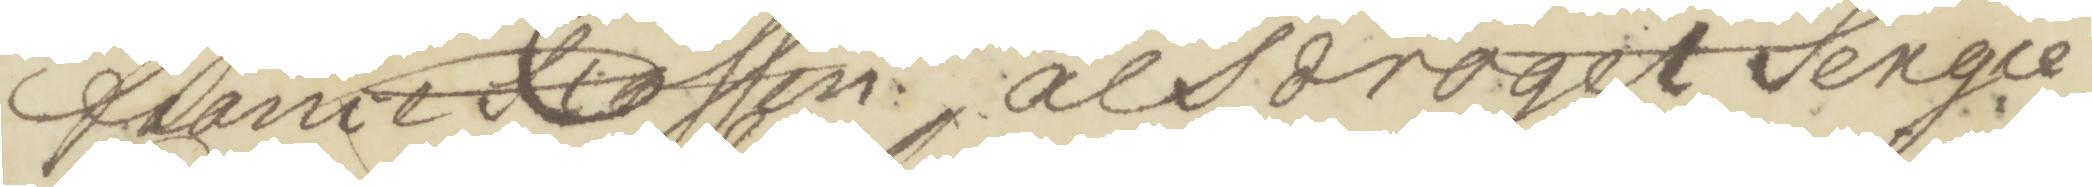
France stoffen: als droget sergie
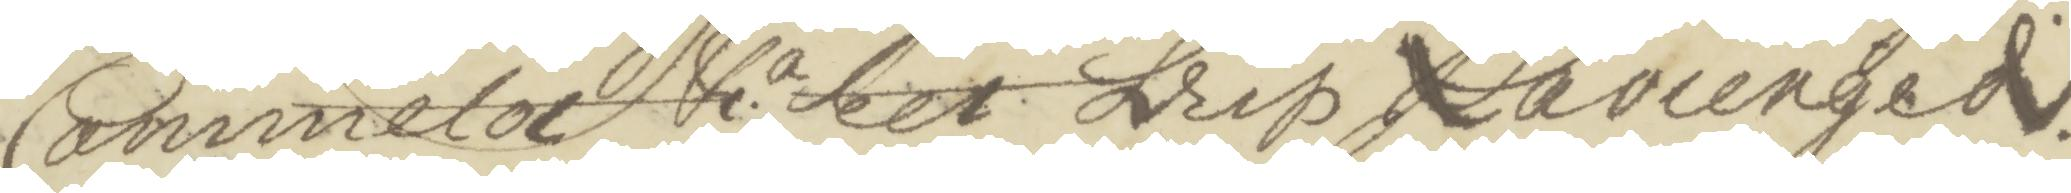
Cammelot Et:a het schip Lavierge de
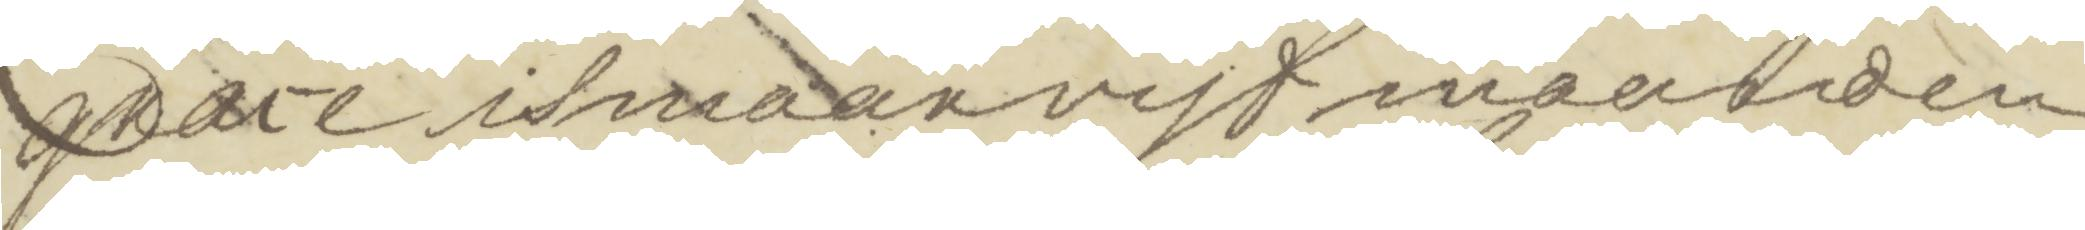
grace is maar vijf maanden
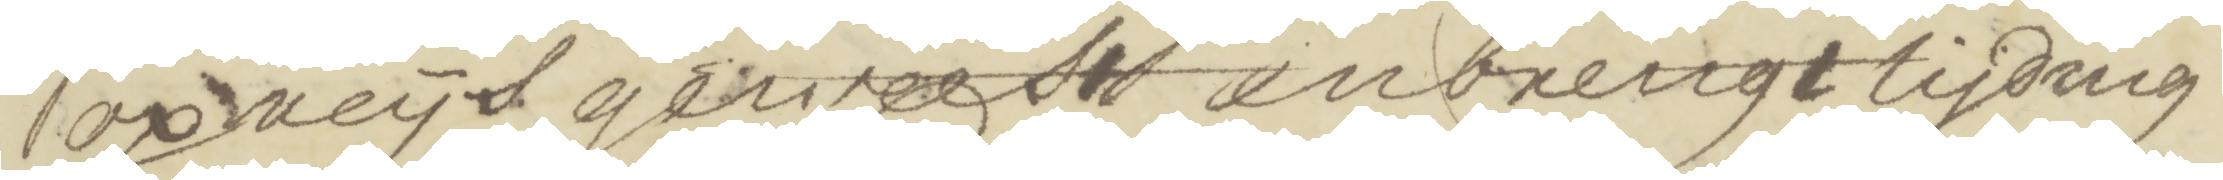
op reijs geweest en brengt tijding
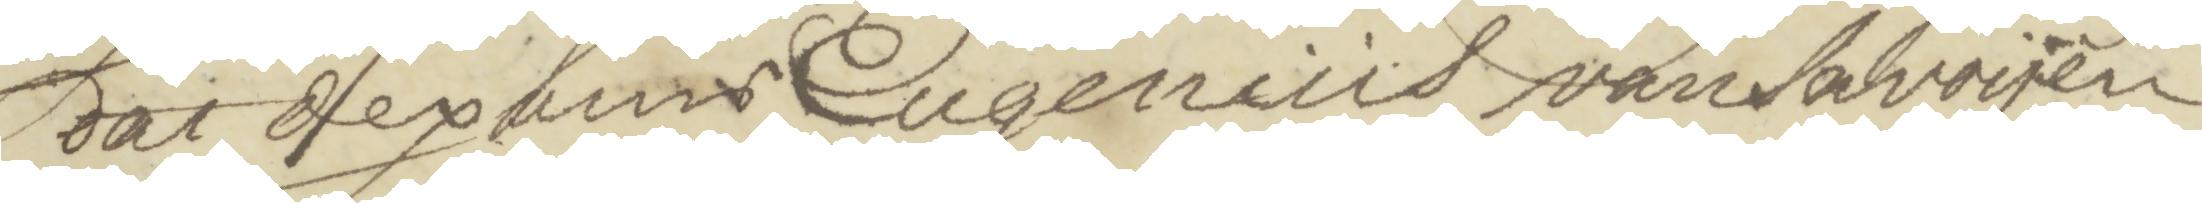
dat de prins Eugenius van savoijen
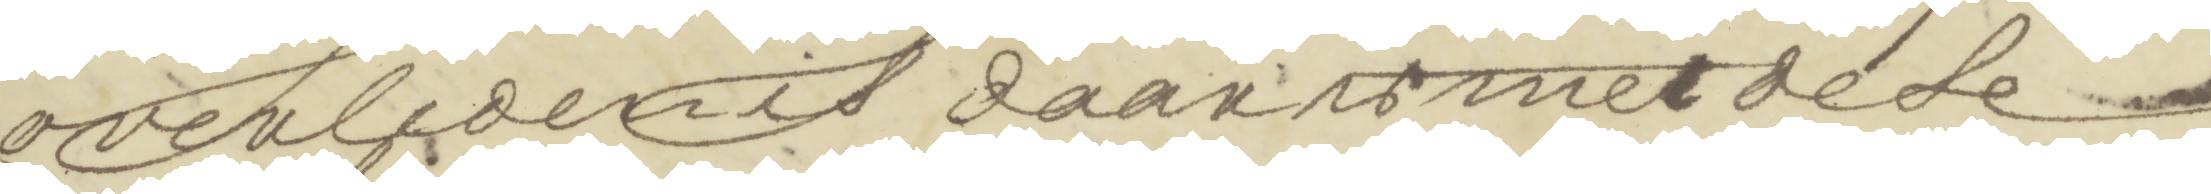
overleden is daar is met dese
